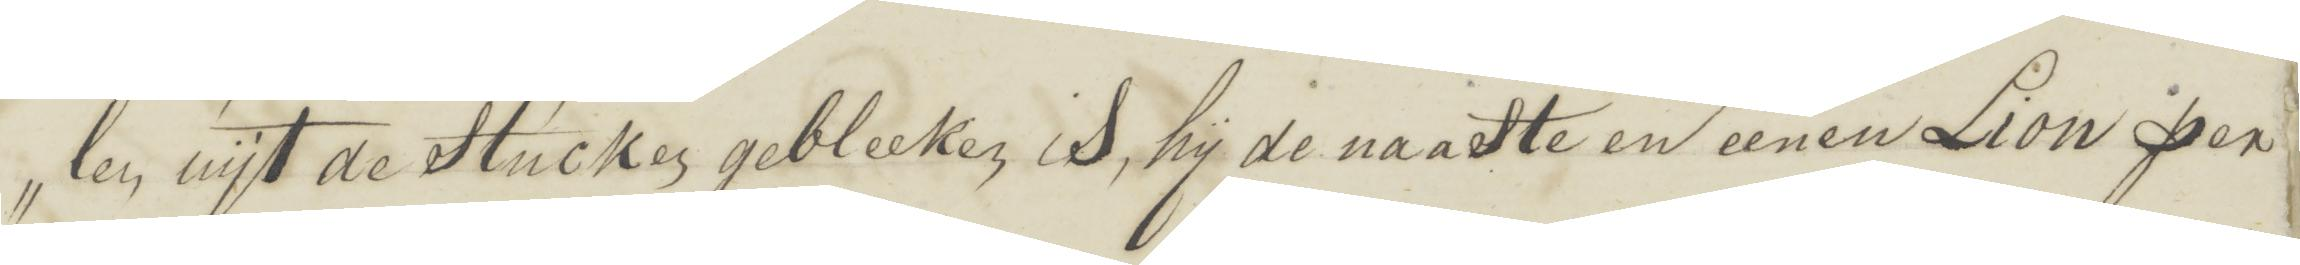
„len uijt de stucken gebleeken is, hij de naaste en eenen Lion per
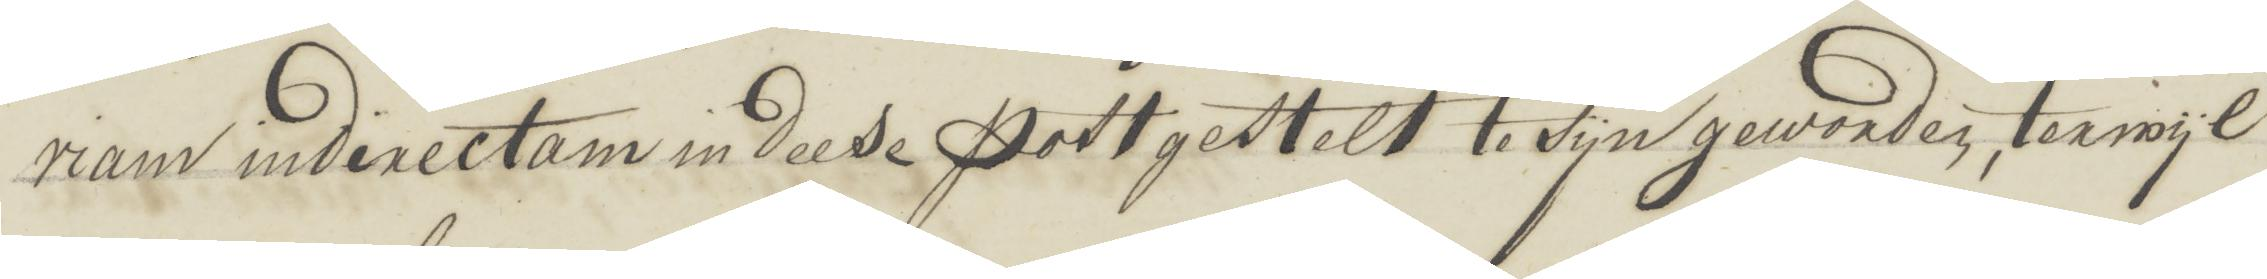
viam indirectam in deese Post gestelt te sijn geworden, terwijl
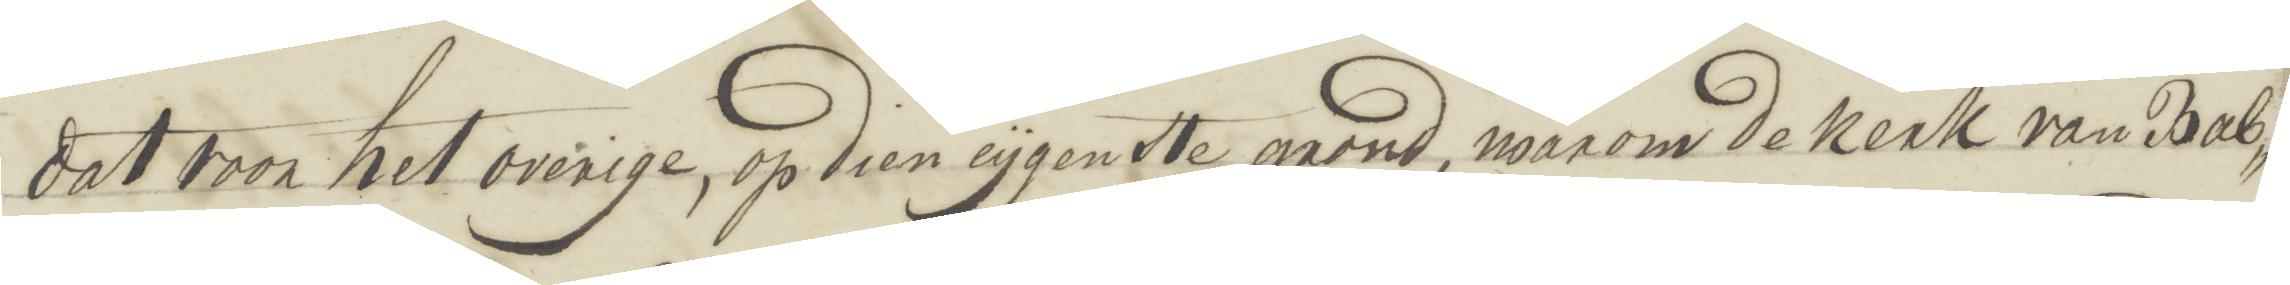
dat voor het overige, op dien eijgenste grond, waarom de kerk van Bab„
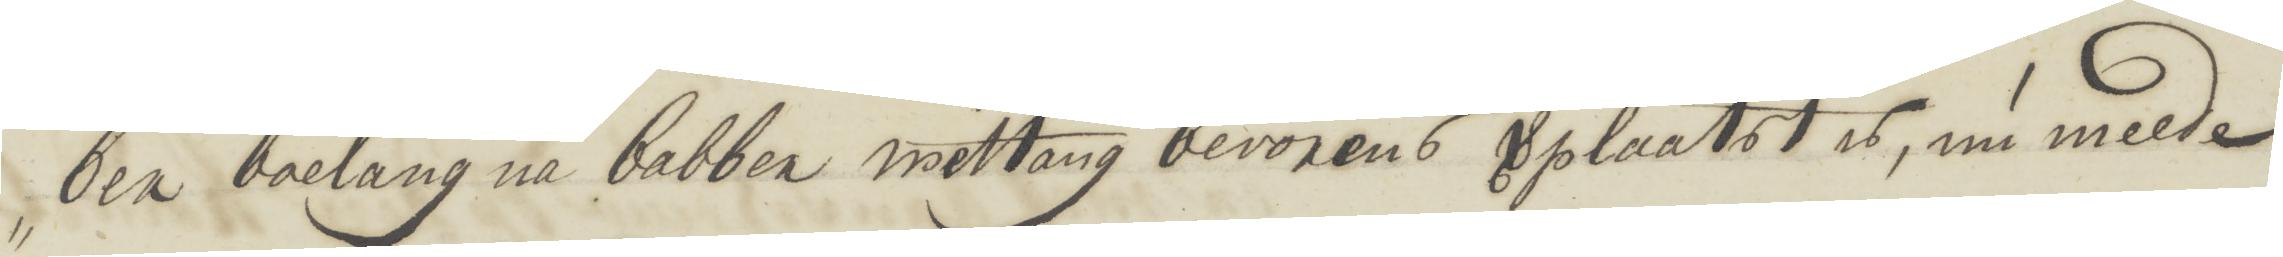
„ber boelang na babber wettang bevorens verplaatst is, nu meede
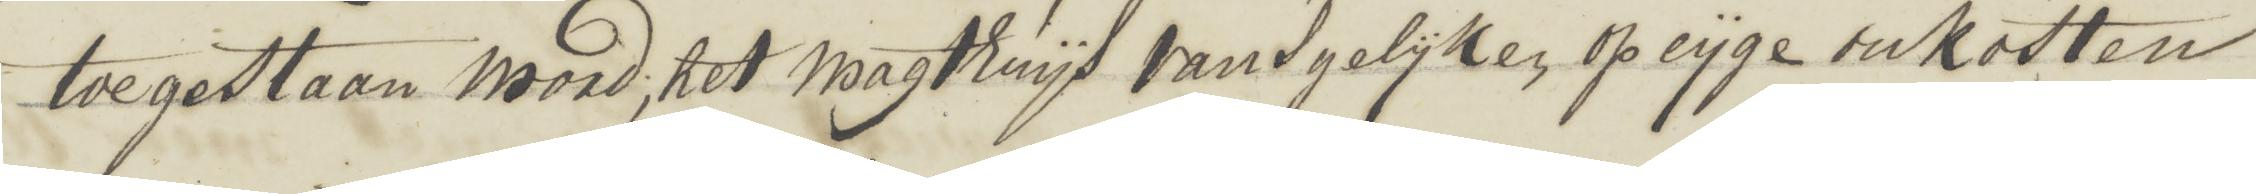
toegestaan word, het wagthuijs van 's gelijken op eijge inkosten
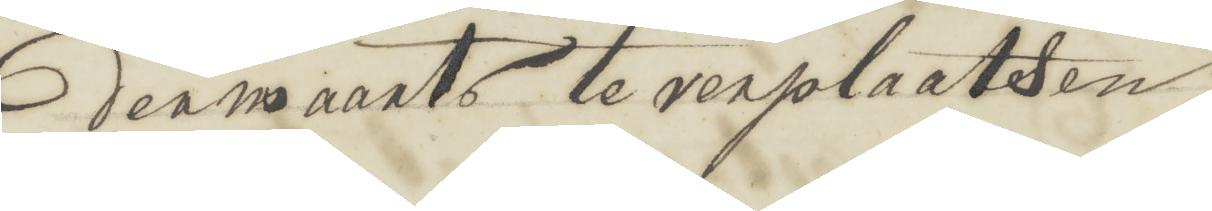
derwaarts te verplaatsen;
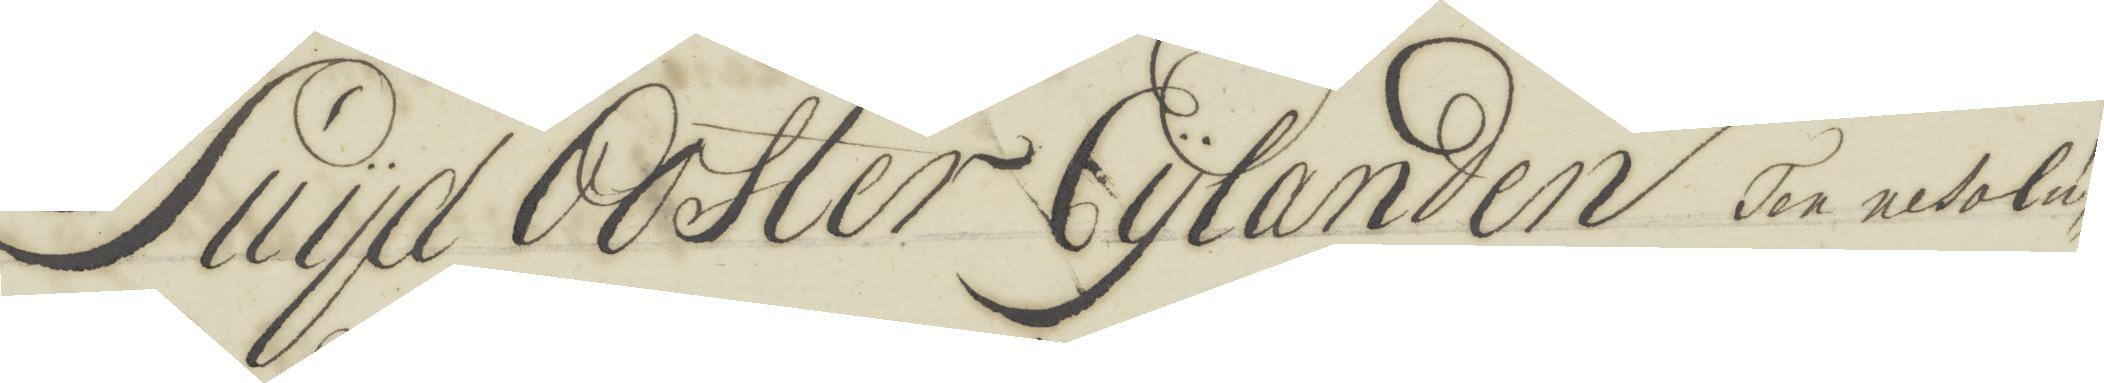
Suijd Ooster Eijlanden Ter resolu
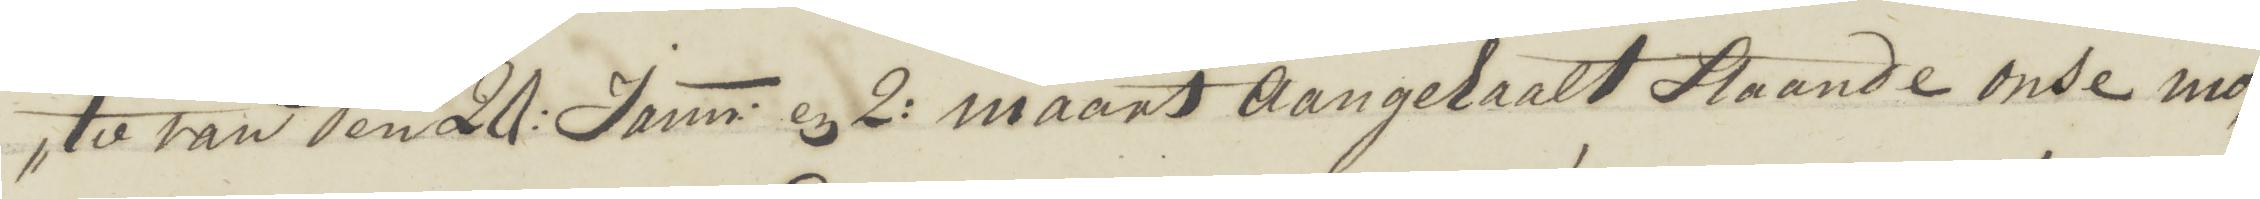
„tie van den 24: Iann: en 2: maart aangehaalt staande onse mo
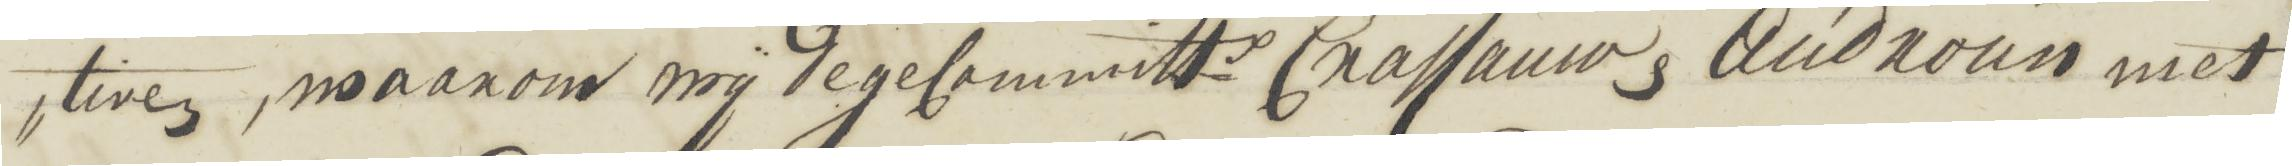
„tiven, waarom wij de gecommitt=s Crassauw en Audroun met
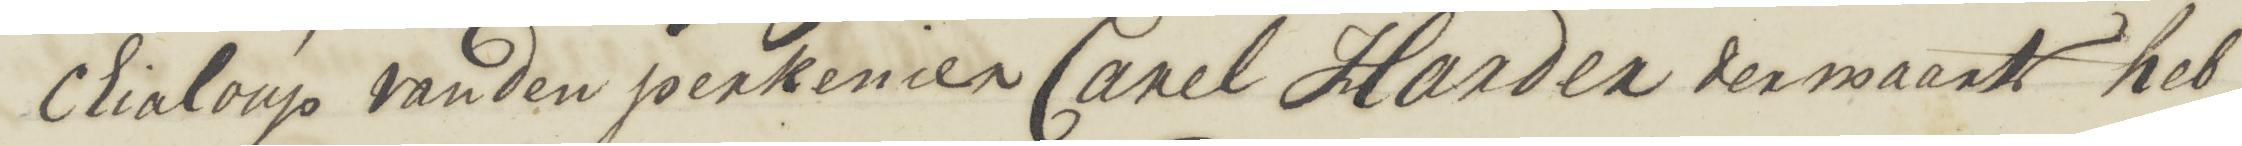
Chialoup van den perkenier Carel Harder derwaarts heb
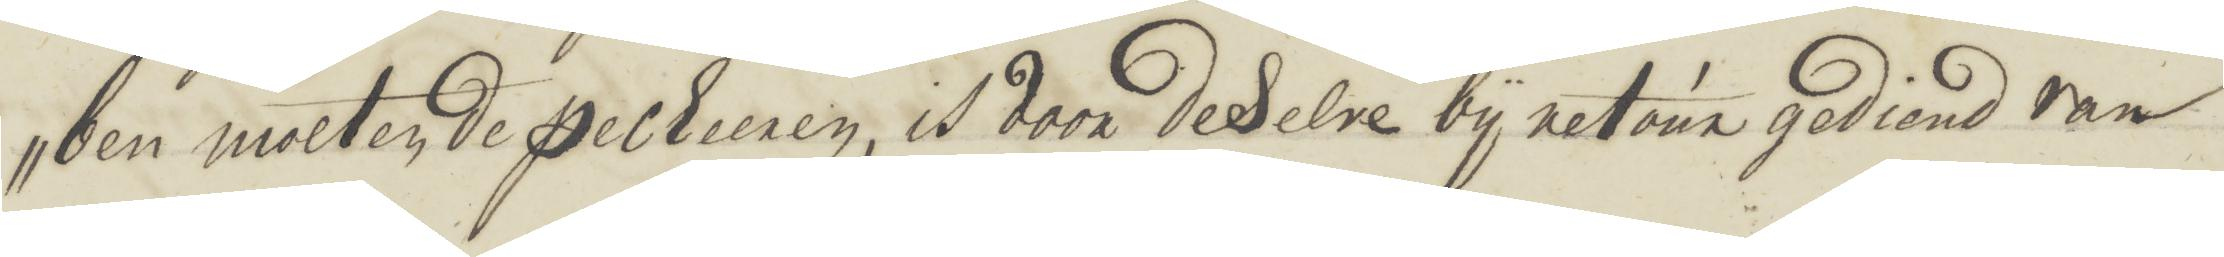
„ben moeten depecheeren, is door deselve bij retour gediend van
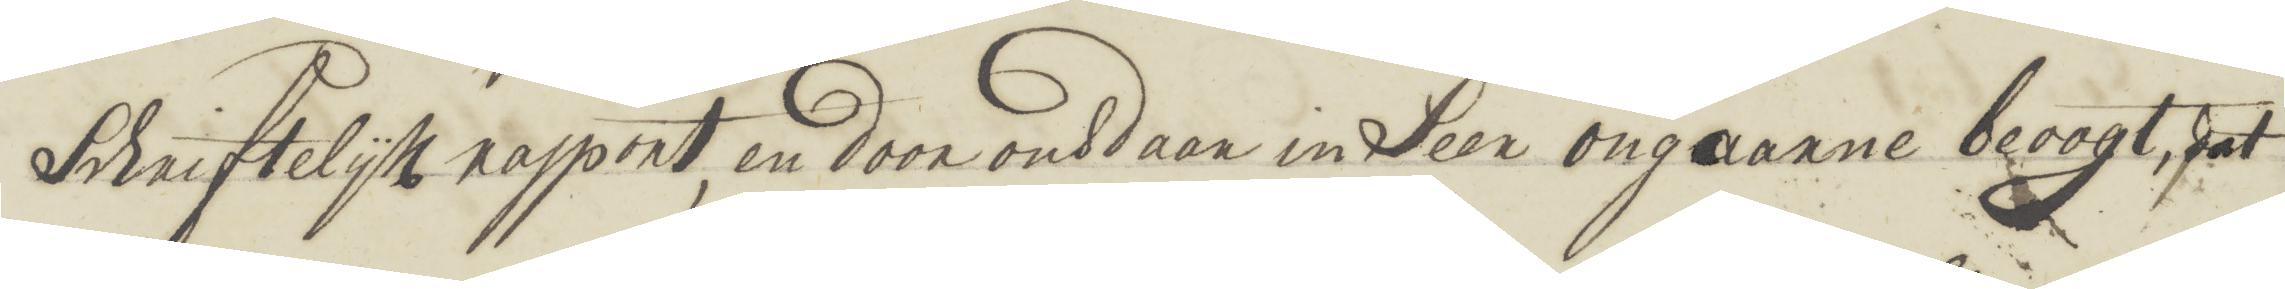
schriftelijk rapport, en door ons daar in seer ongaarne beoogt, dat
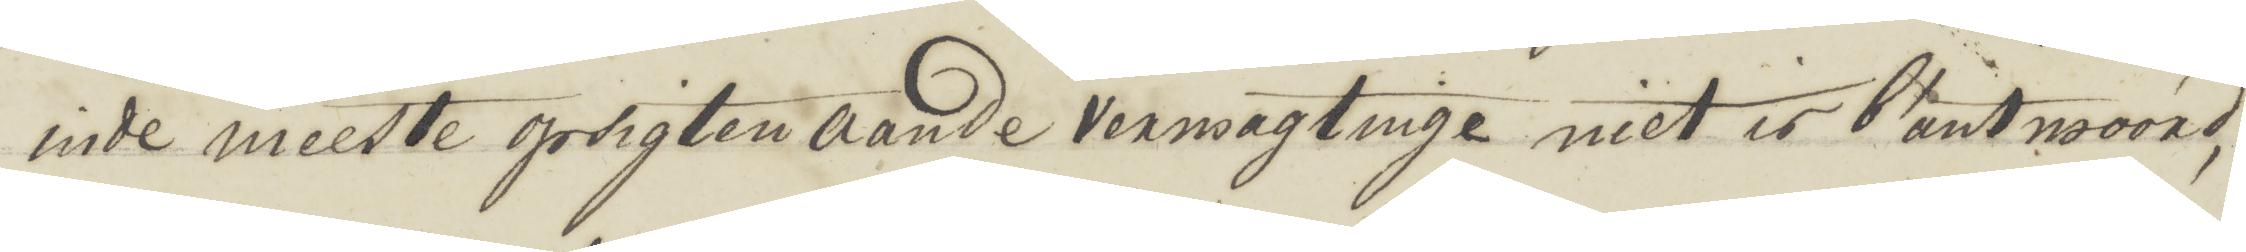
inde meeste opsigten aande verwagtinge niet is b'antwoord,
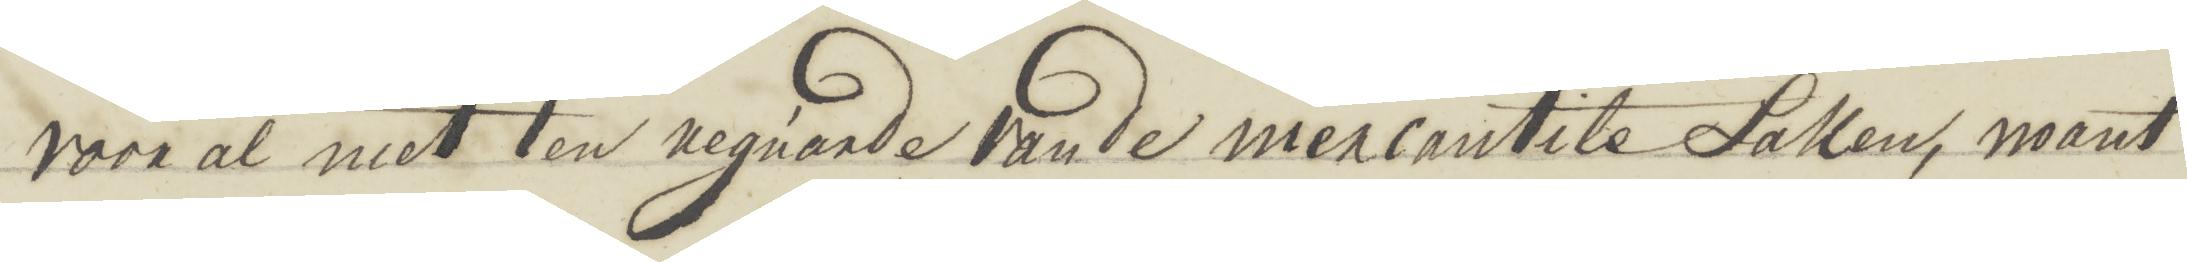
voor al niet ten reguarde van de mercantile saken, want
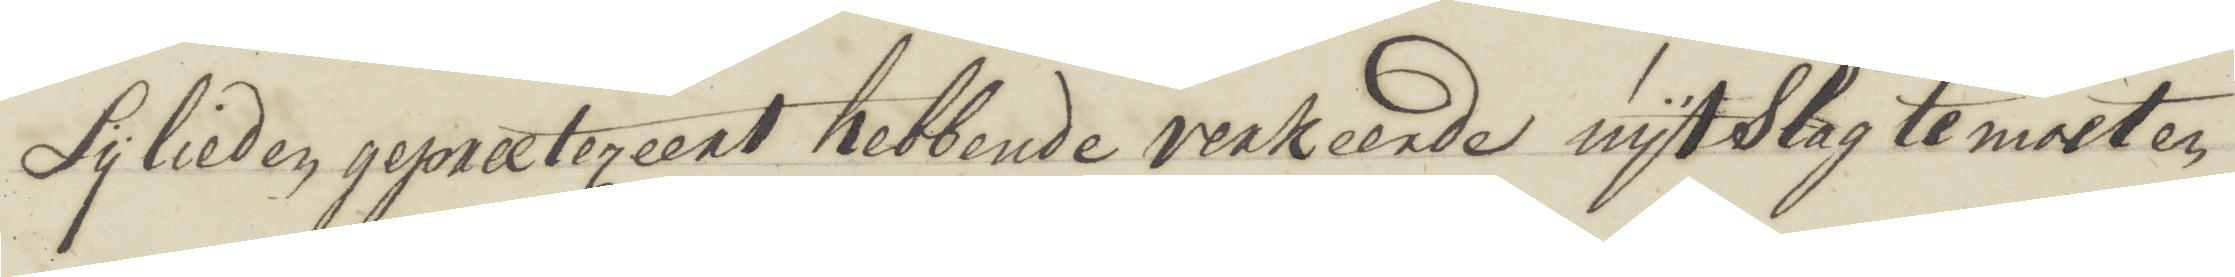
sij lieden gepraetereert hebbende verkeerde uijtslag te moeten
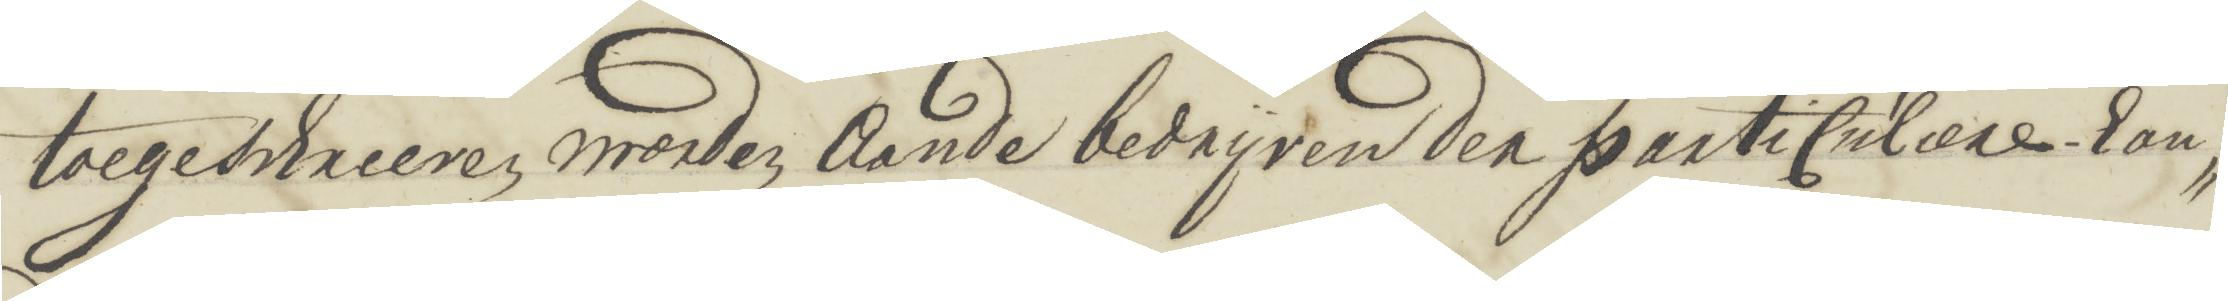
toegeschreeven worden Aande bedrijven der particuliere-han
